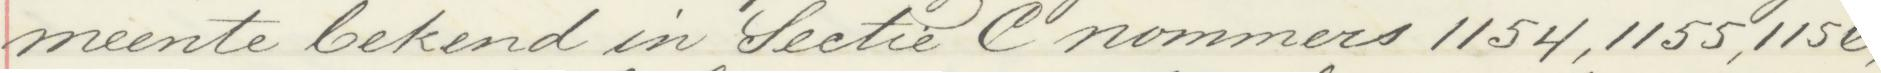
meente bekend in sectie C nommers 1154, 1155, 1156,
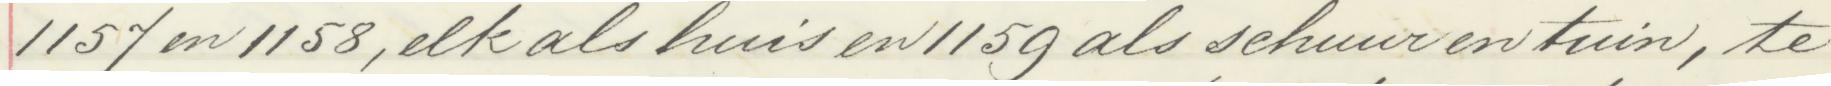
1157 en 1158, elk als huis en 1159 als schuur en tuin, te
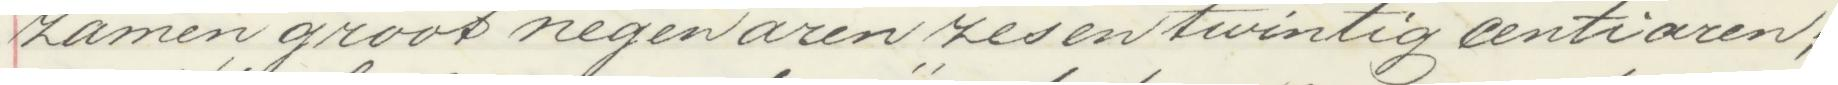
zamen groot negen aren zes en twintig centiaren;
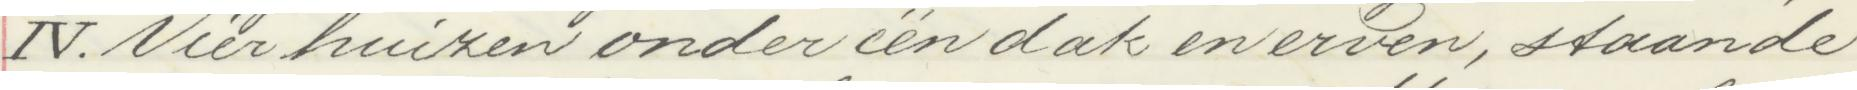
IV. Vier huizen onder één dak en erven, staande
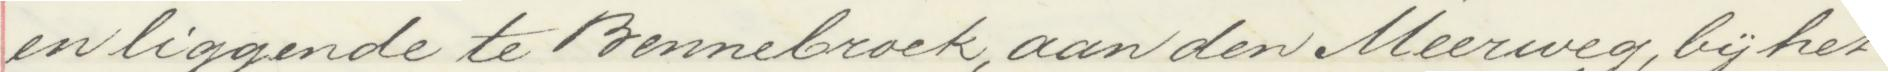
en liggende te Bennebroek, aan den Meerweg, bij het
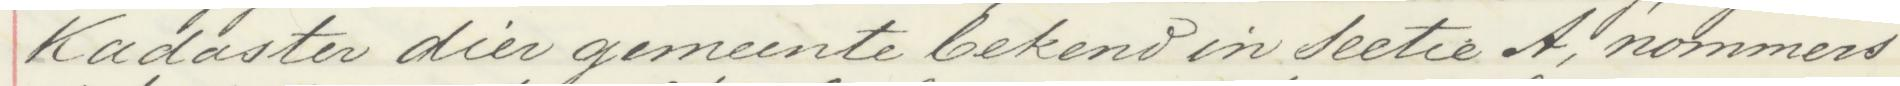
Kadaster dier gemeente bekend in sectie A, nommers
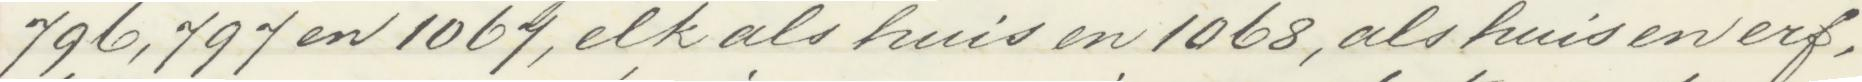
796, 797 en 1067, elk als huis en 1068, als huis en erf,
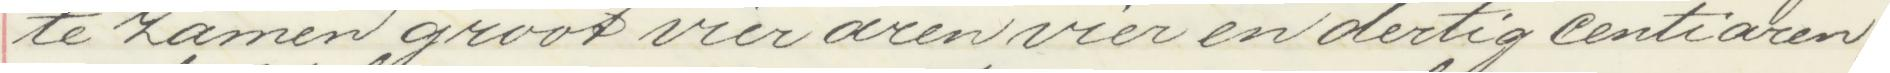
te zamen groot vier aren vier en dertig centiaren;
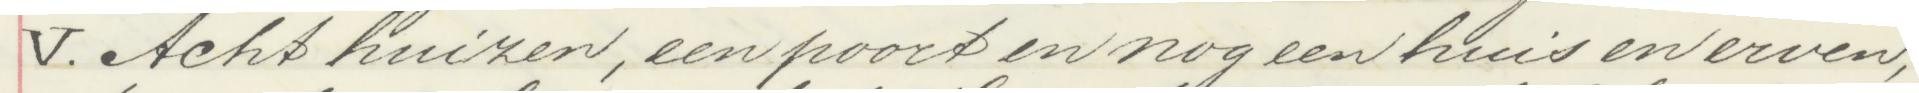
V. Acht huizen, een poort en nog een huis en erven,
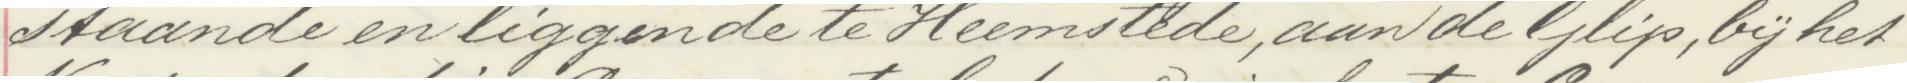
staande en liggende te Heemstede, aan de Glip, bij het
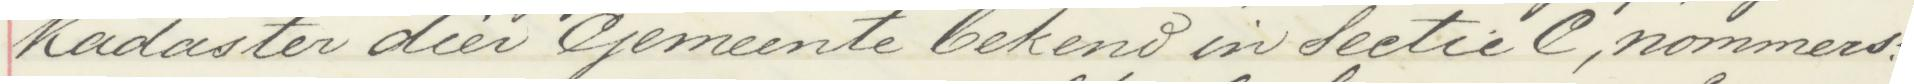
Kadaster dier Gemeente bekend in sectie C, nommers:
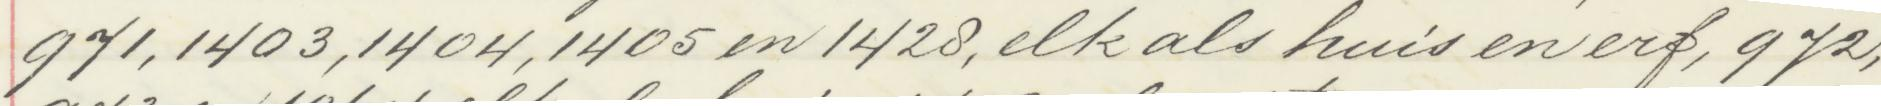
971, 1403, 1404, 1405 en 1428, elk als huis en erf, 972,
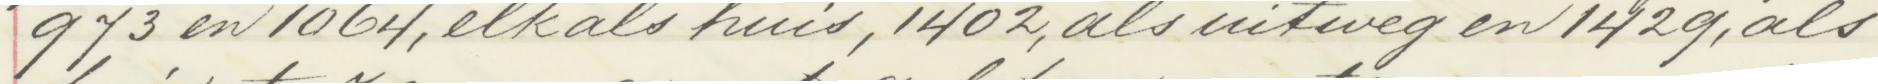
973 en 1064, elk als huis, 1402, als uitweg en 1429, als
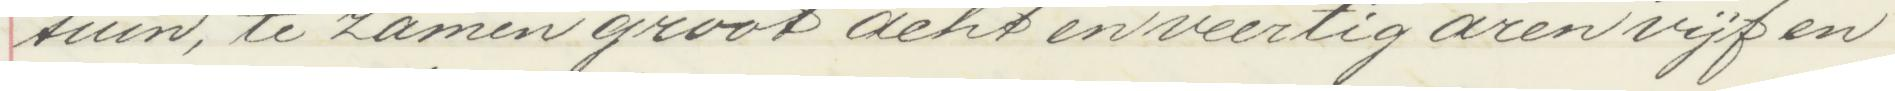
tuin, te zamen groot acht en veertig aren vijf en
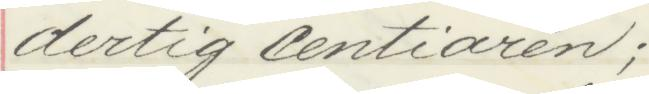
dertig centiaren;
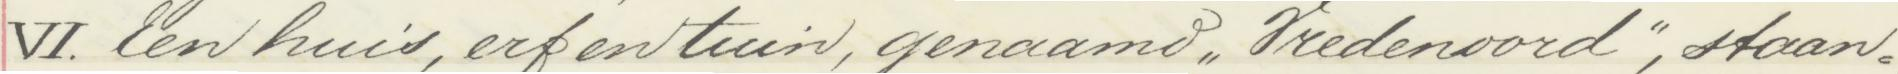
VI. Een huis, erf en tuin, genaamd „Vredenoord", staan=
